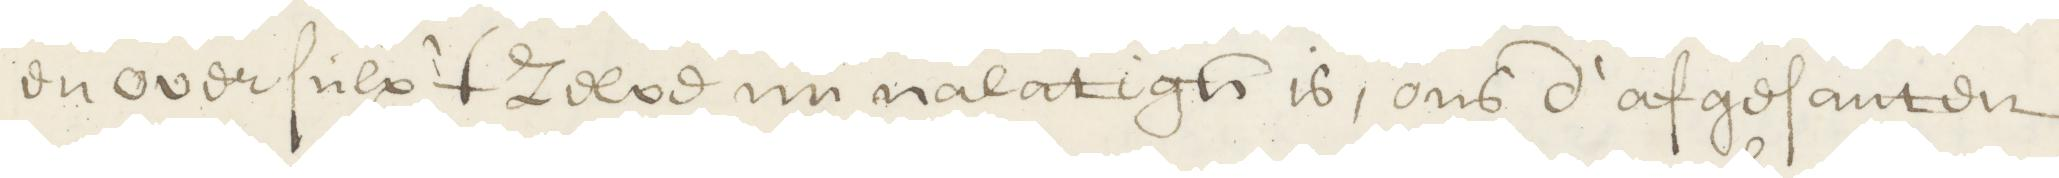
en over sulx ’t zelve nu nalatigh is, ons d’afgesanten
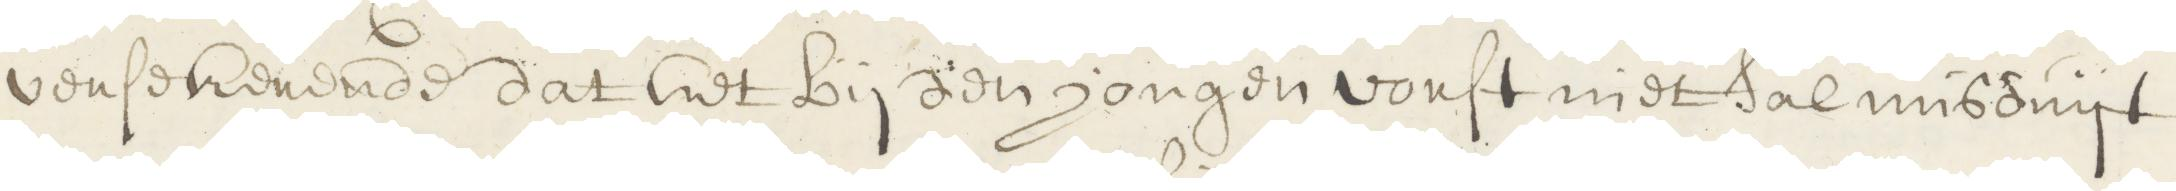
versekerende dat het bij den jongen vorst niet sal misduijt
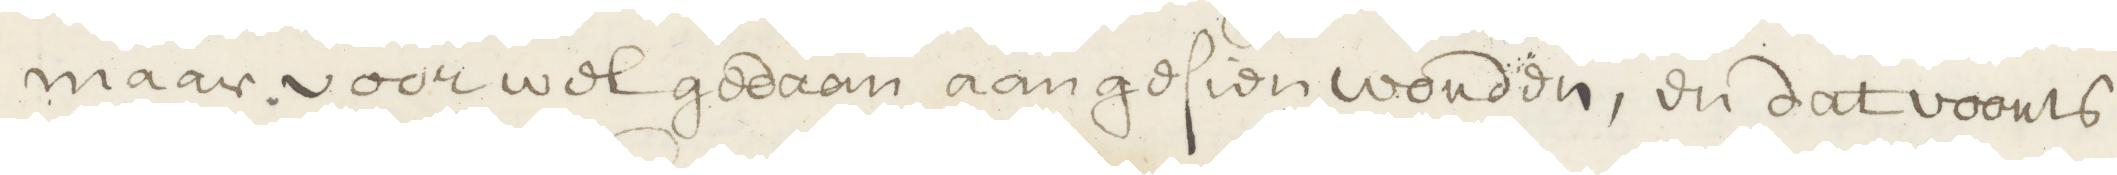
maar voor wel gedaan aan gesien worden, en dat voorts
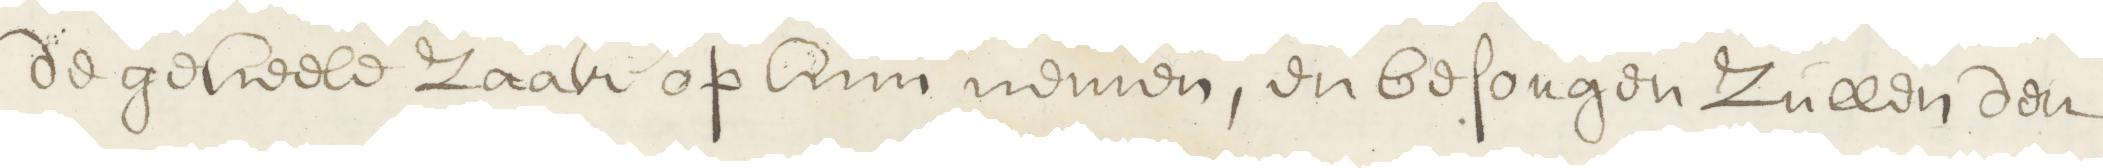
de geheele zaak op hun nemen, en besorgen zullen den
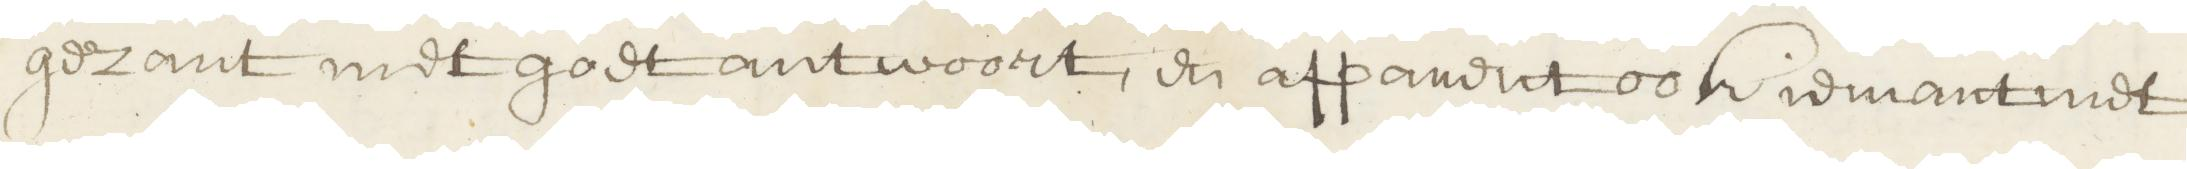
gezant met goet antwoort, en apparent ook iemant met
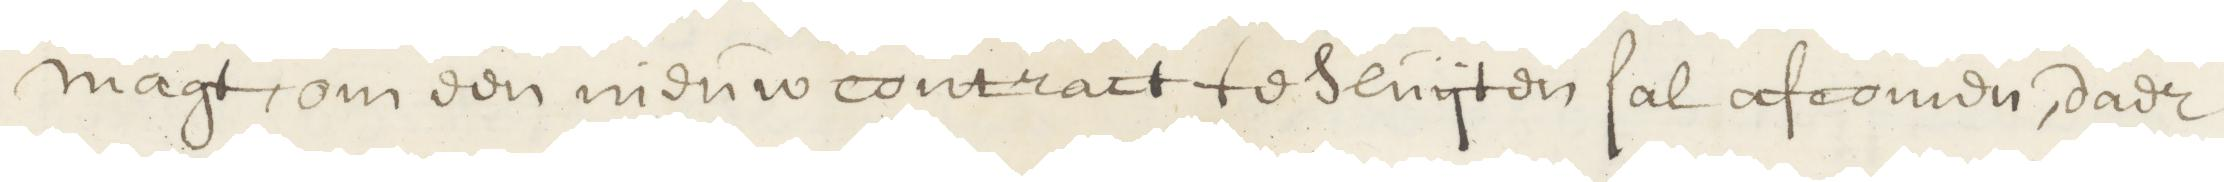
magt, om een nieuw contract te sluijten sal afcomen, daer
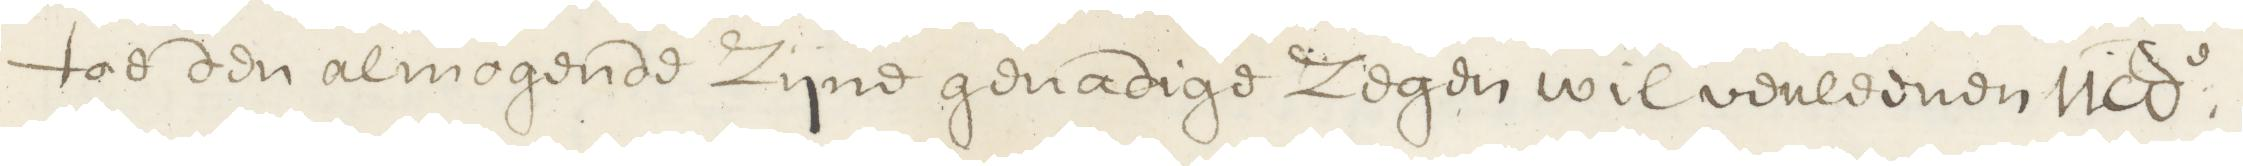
toe den almogende zijne genadige zegen wil verleenen UEd„e
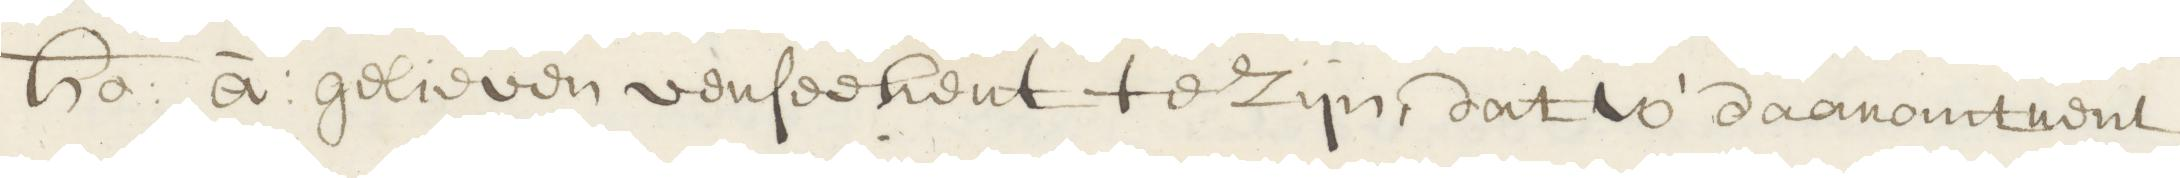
Ho: a: gelieven verseekent te zijn, dat w' daaromtrent
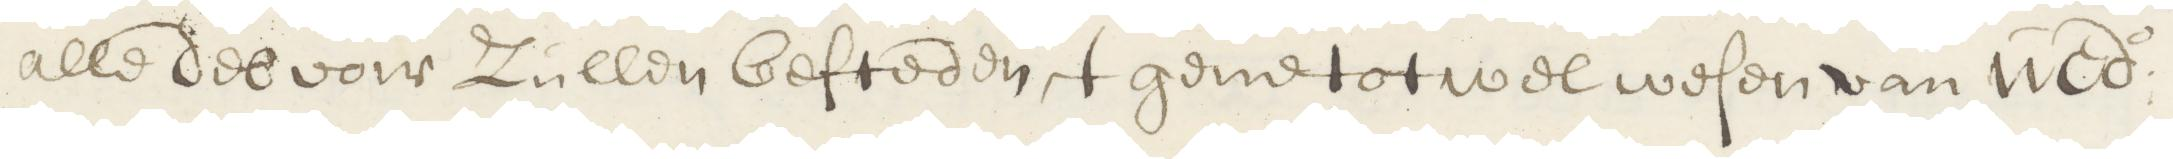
alle desvoir zullen besteden, 't gene tot wel wesen van UEd:e
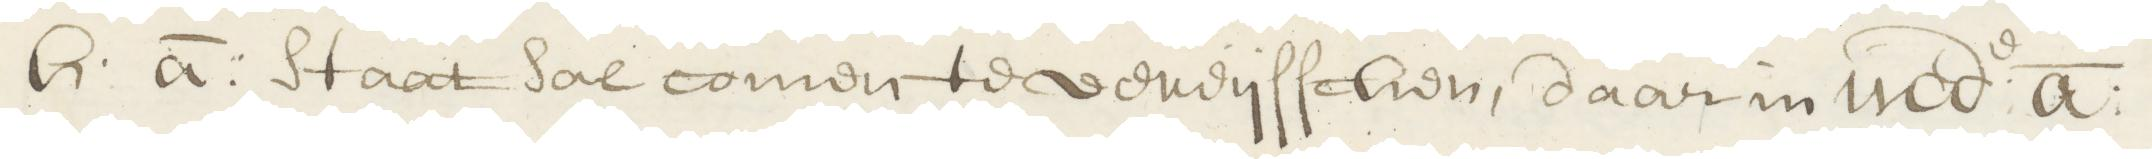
H: a: staat sal comen te vereijsschen, daar in UEd:e a:
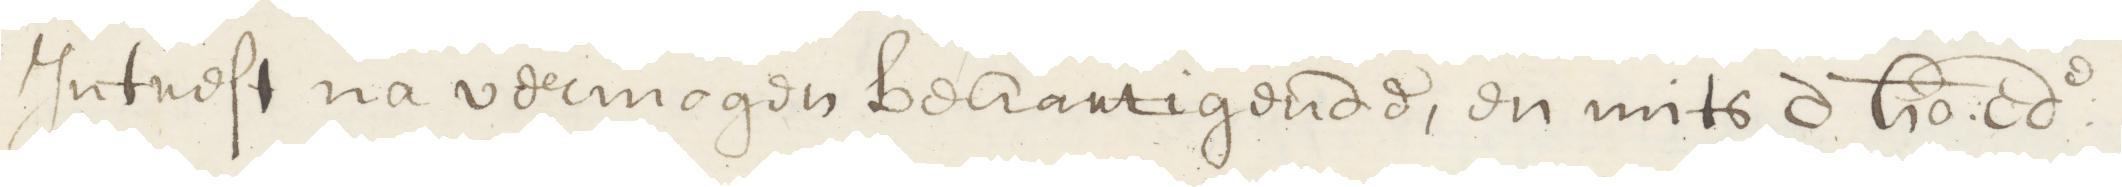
Jntrest na vermogen behartigende, en mits d Ho: Ed:e
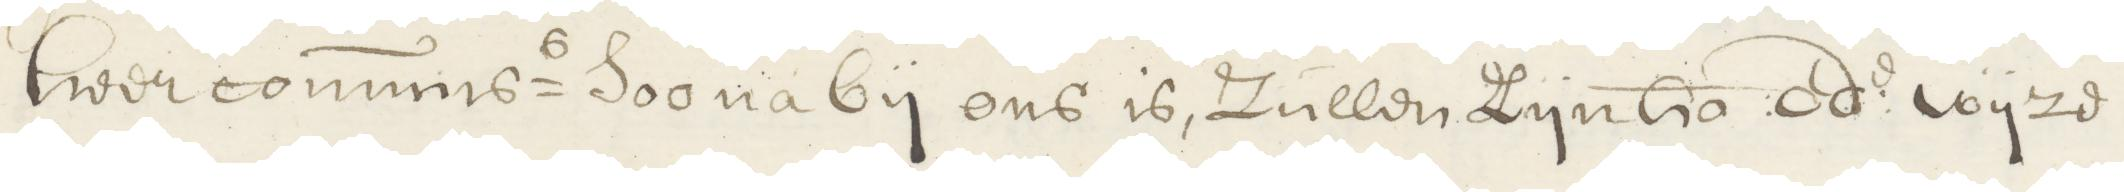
heer commis=s soo na bij ons is, zullen zijn ho: Ed:e wijze
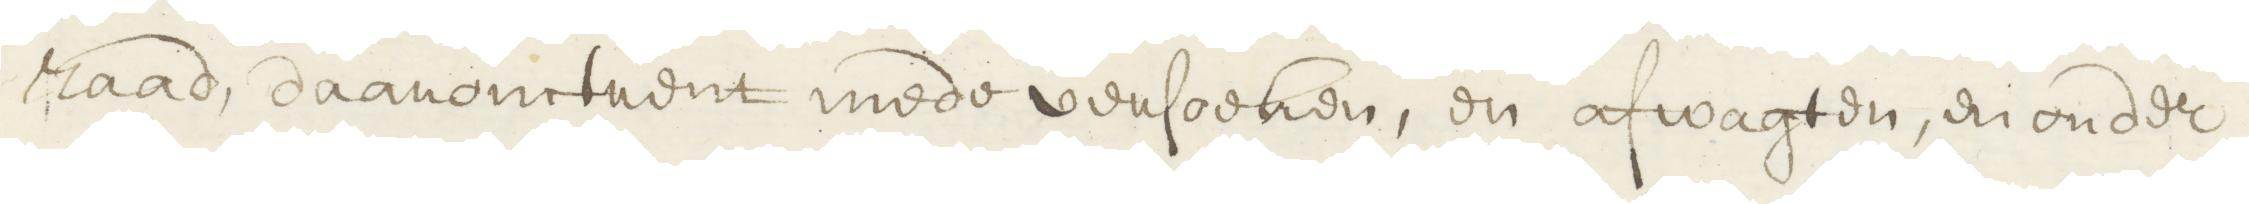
raad, daaromtrent mede versoeken, en afwagten, en onder
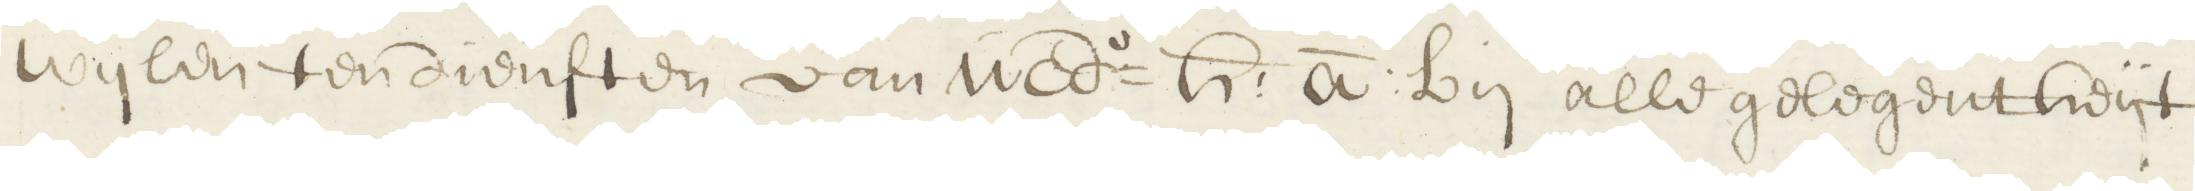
wijlen ten diensten van UEd=e h: a: bij alle gelegentheijt
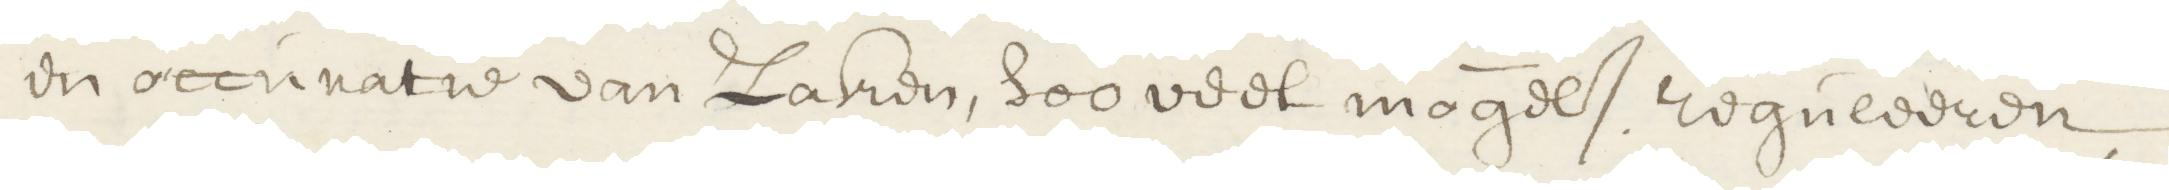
en occuratie van zaken, soo veel mogelijk reguleeren,
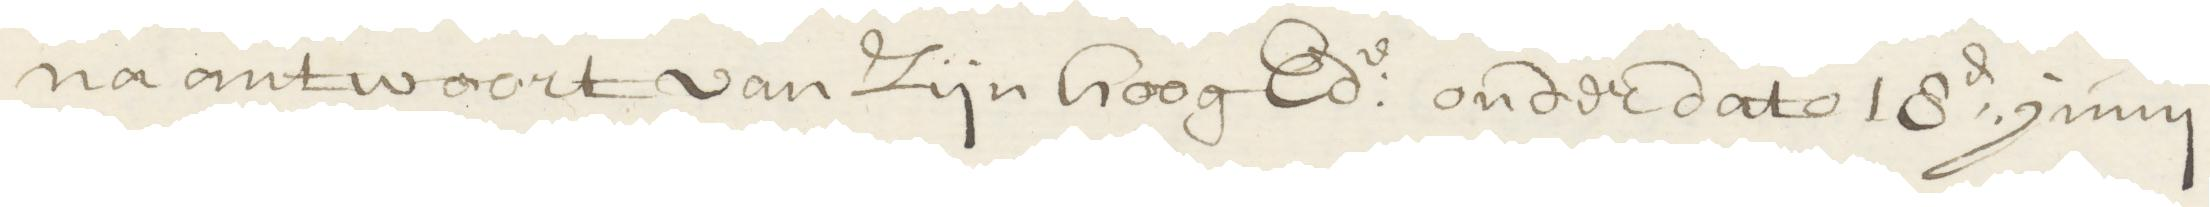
na antwoort van zijn hoog Ed:e onder dato 18„en junij
